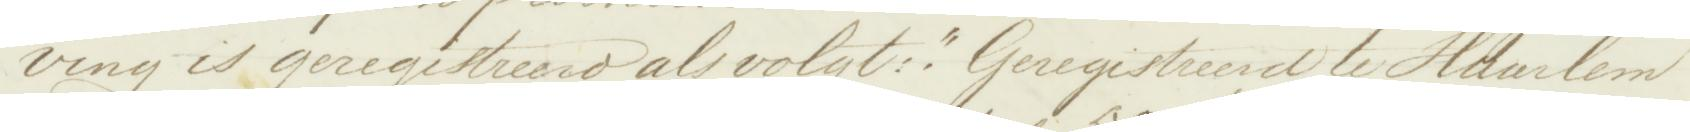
ving is geregistreerd als volgt: "Geregistreerd te Haarlem
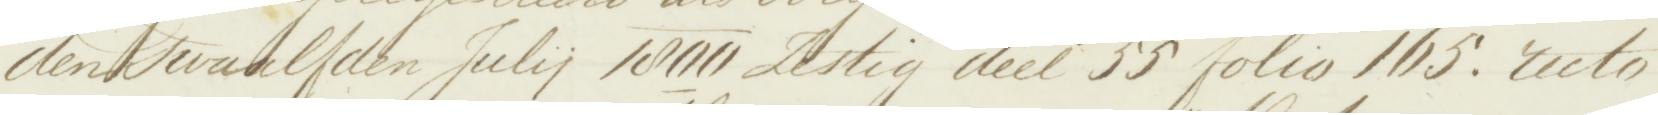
den Twaalfden Julij 1800 Zestig deel 55 folio 165. recto
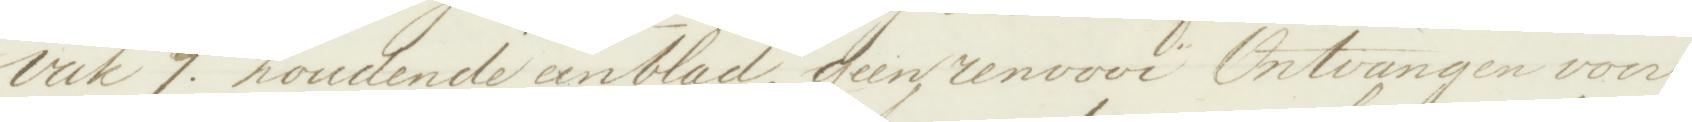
vak 7. houdende een blad, geen, renvooi Ontvangen voor
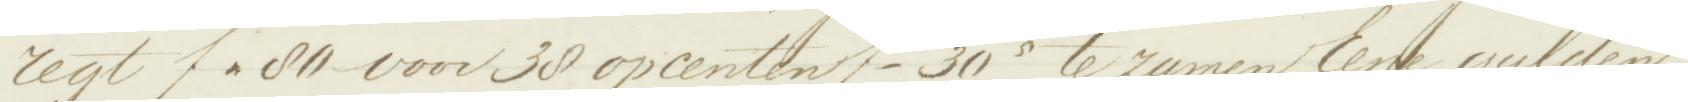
regt ƒ„81 voor 38 opcenten ƒ- 30' te zamen Eene gulden
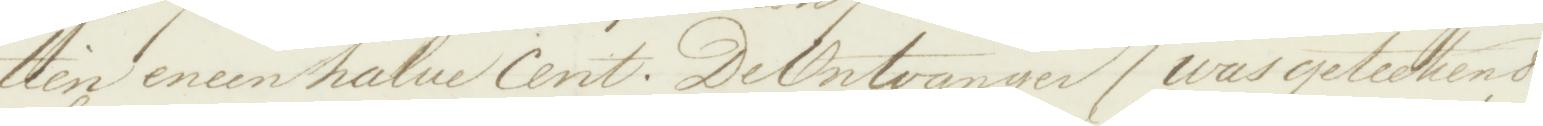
tien en een halve Cent. De Ontvanger (was geteekend)
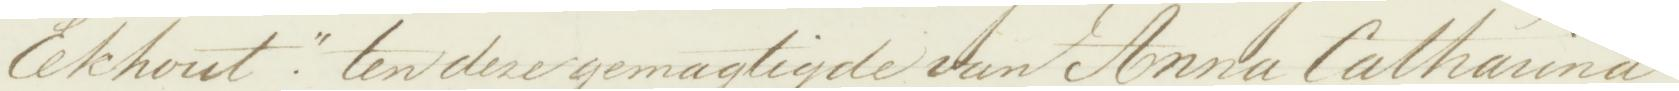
Eekhout." ten deze gemagtigde van Anna Catharina
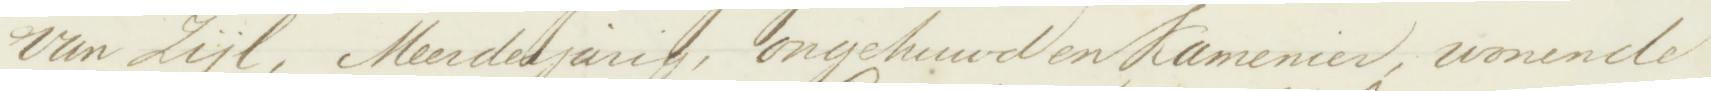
van Zijl, Meerderjarig, ongehuwd en Kamenier, wonende
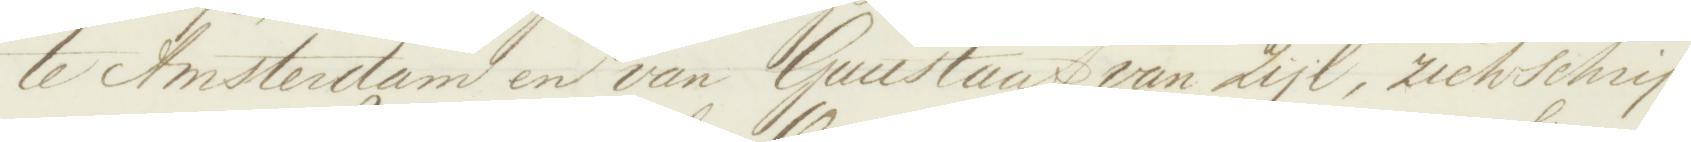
te Amsterdam en van Guustaaf van Zijl, zich schrij
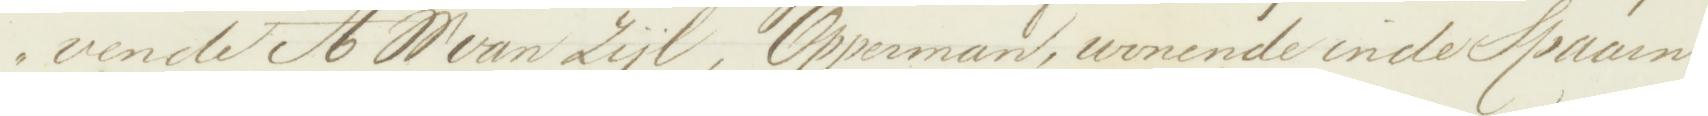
„vende A W van Zijl Opperman, wonende in de Spaarn
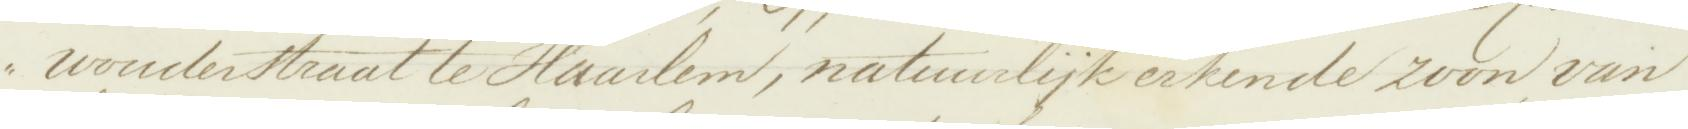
„wouderstraat te Haarlem, natuurlijk erkende zoon van
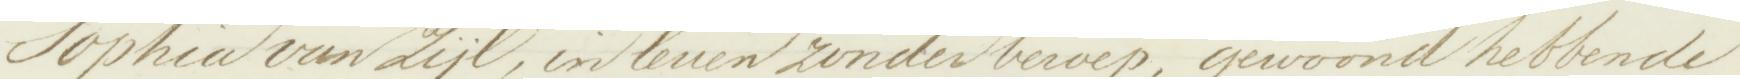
Sophia van Zijl, in leven zonder beroep, gewoond hebbende
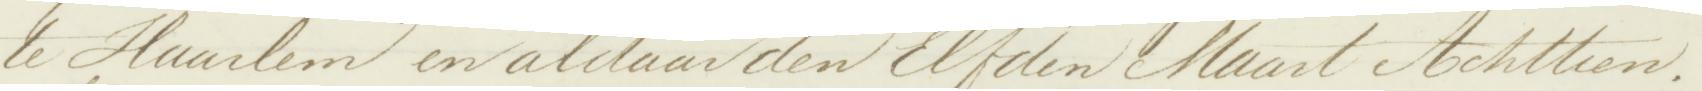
te Haarlem en aldaar den Elfden Maart Achttien„
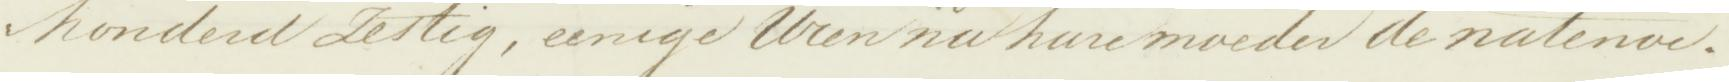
honderd Zestig, eenige Uren na hare moeder de natenoe„
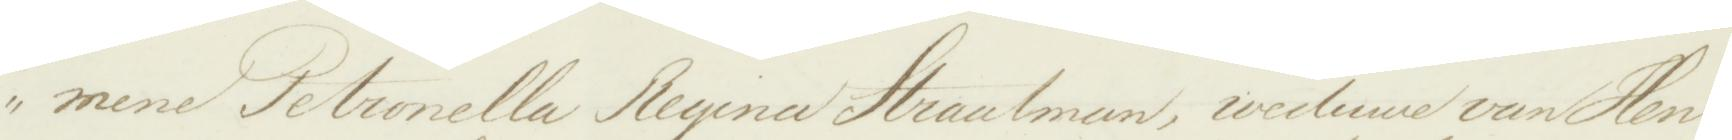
„mene Petronella Regina Straatman, weduwe van Hen
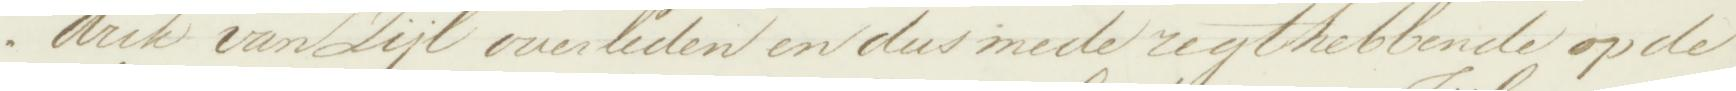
„drik van Zijl overleden en dus mede regthebbende op de
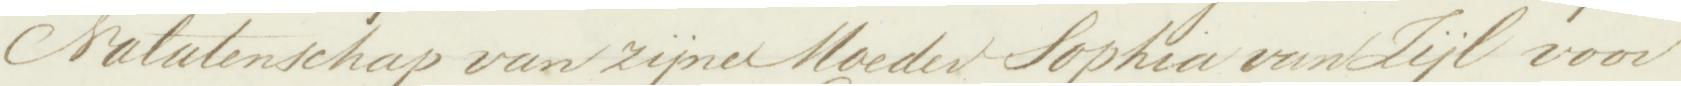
Nalatenschap van zijne Moeder Sophia van Zijl voor
